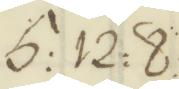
5:12:8
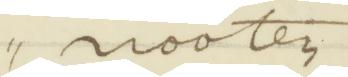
1. „ nooten
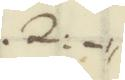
2:–
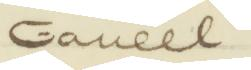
caneel
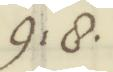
9:8.
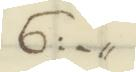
6:–„
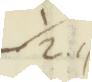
½.
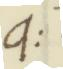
4: 14:
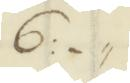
6: – „
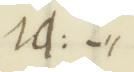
14: –„
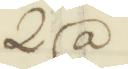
2@
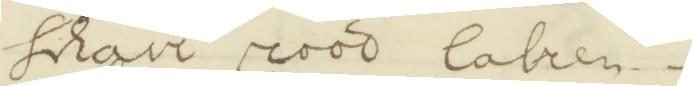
schair rood laken -
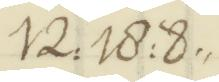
12:18:8„
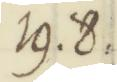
19.8
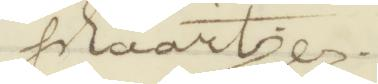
1: „ schaartjes -
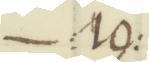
—:19
